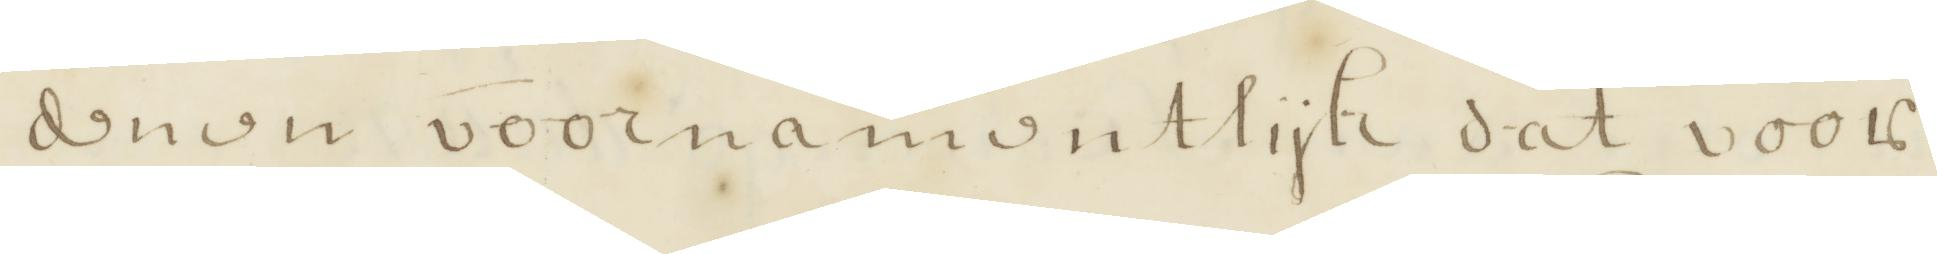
denen voornamentlijk dat voor
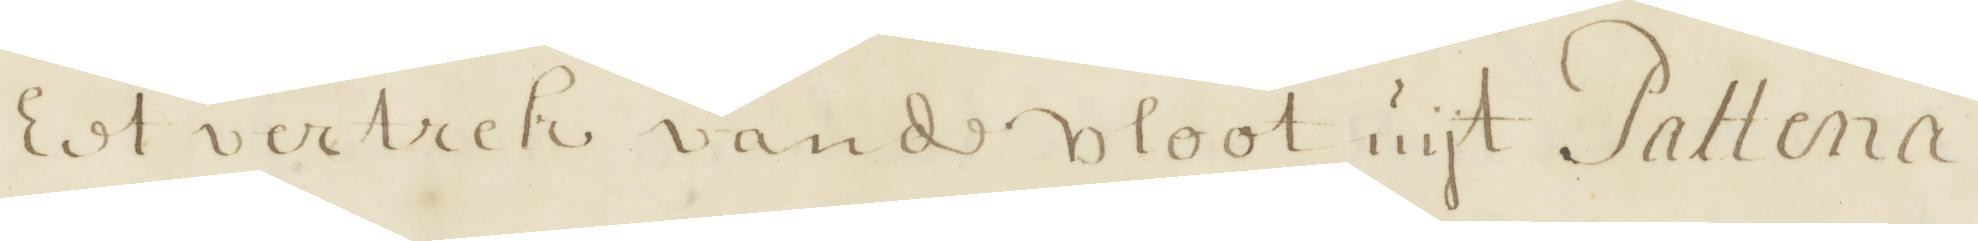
het vertrek van de vloot uijt Pattena
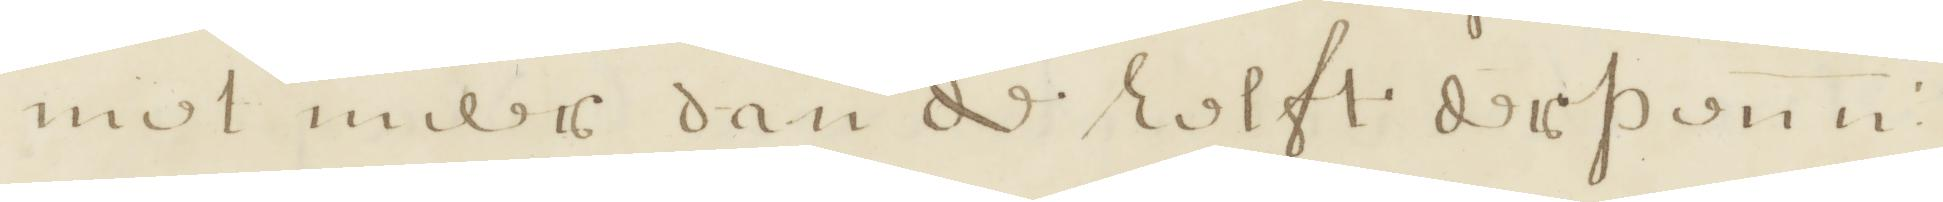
niet meer dan de helft der penn:
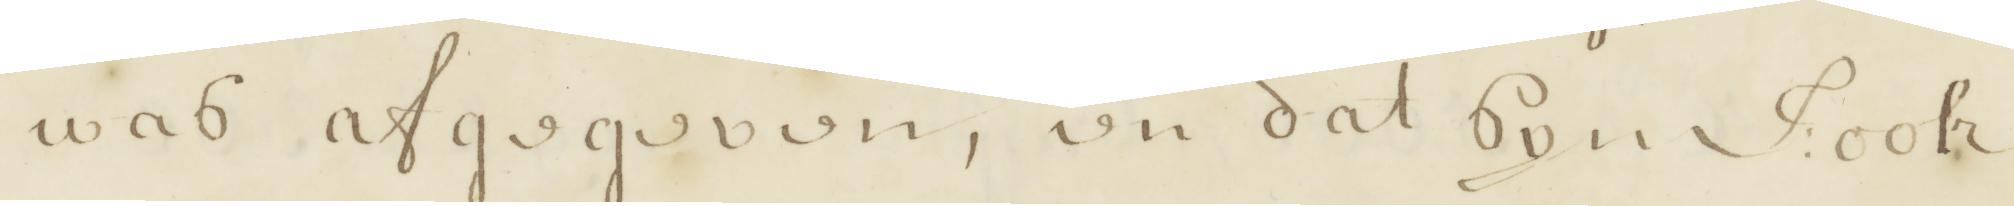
was afgegeven, en dat syn E. ook
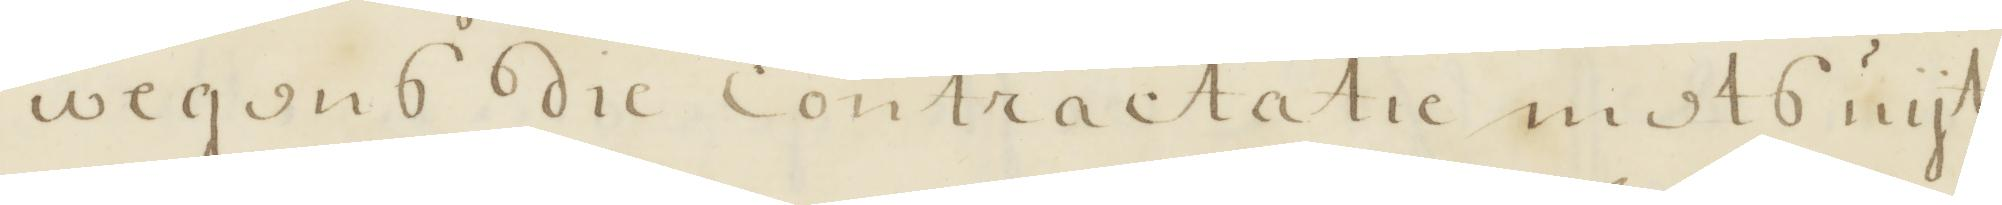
wegens die contractatie niets uijt
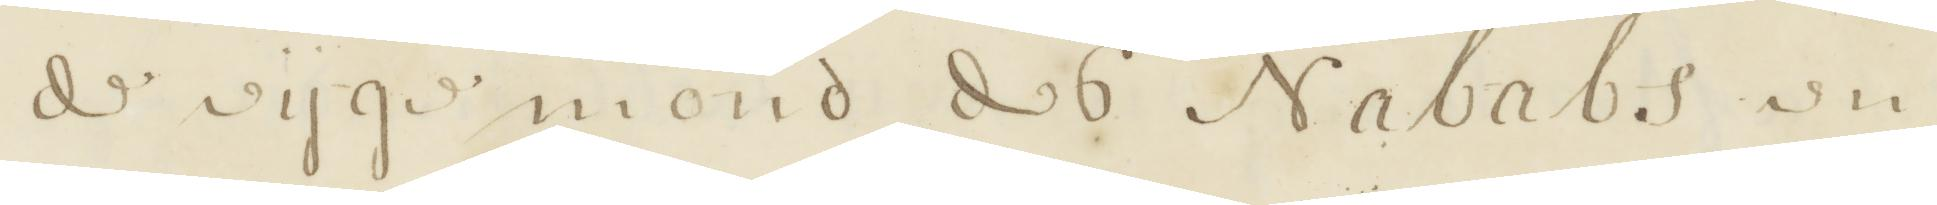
de eijge mond des Nababs en
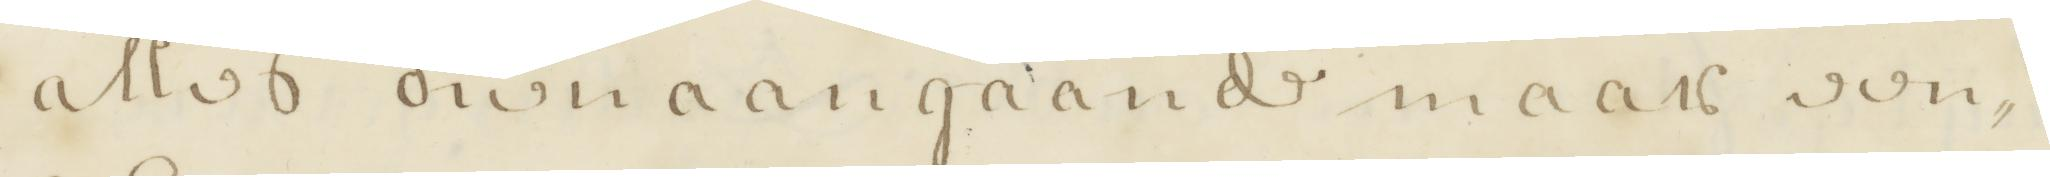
alles dienaangaande maar een„
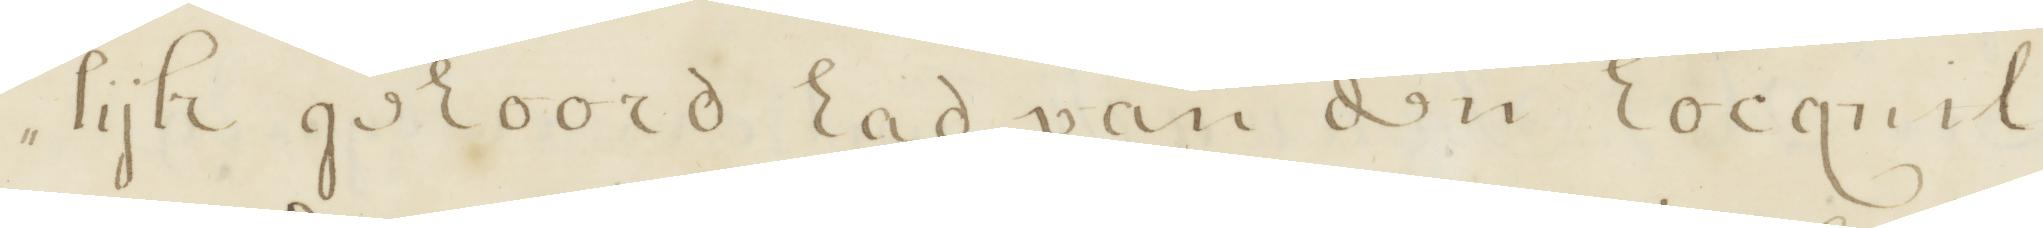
„lijk gehoord had van den hocquil
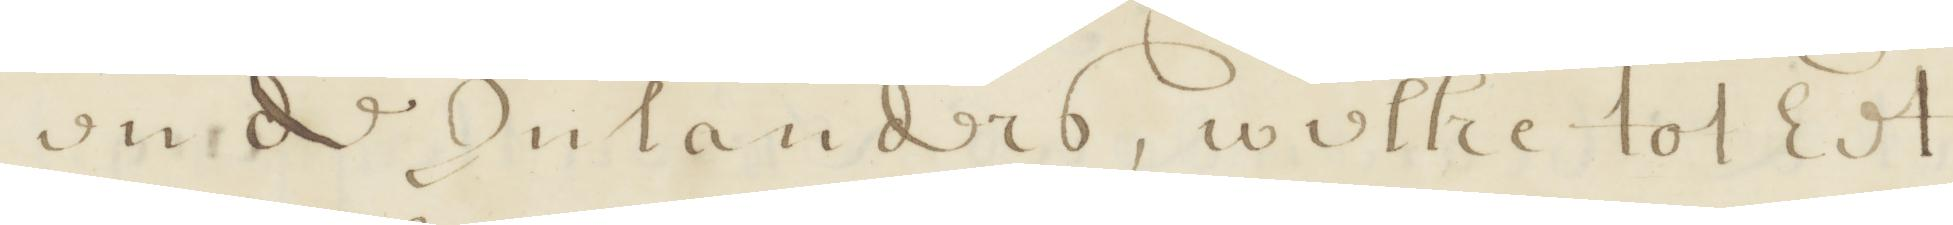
ende jnlanders, welke tot het
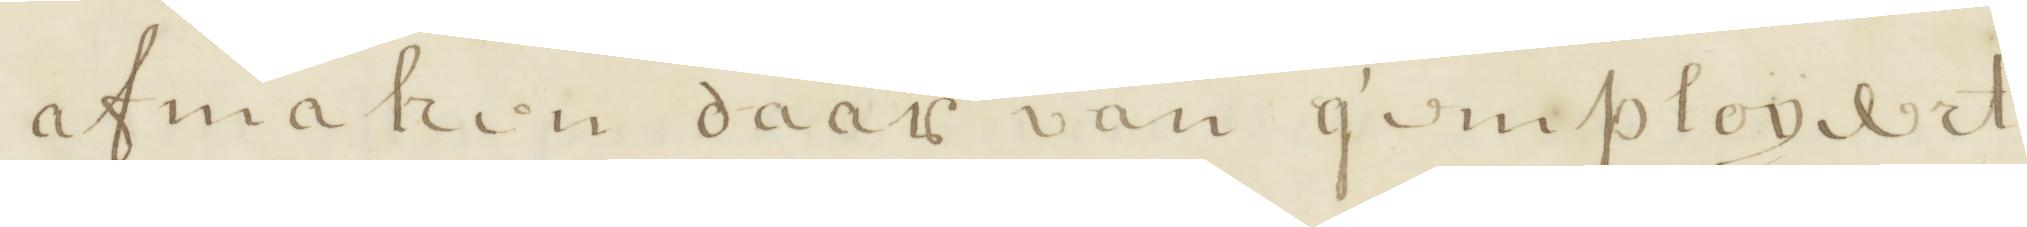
afmaken daar van g'emploijeert
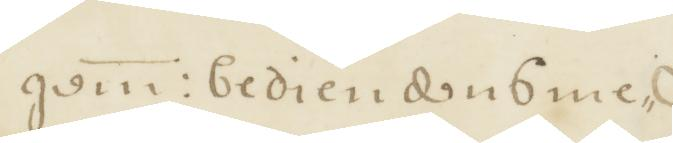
gem: bediendens me„
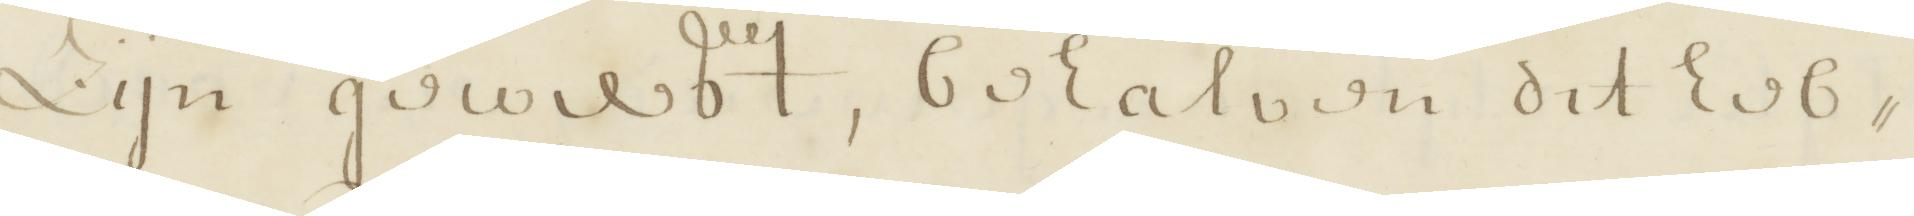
zijn geweest, behalven dit heb„
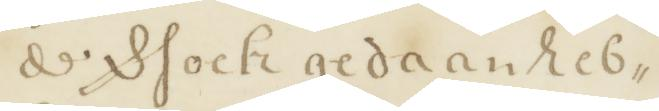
de versoek gedaan heb„
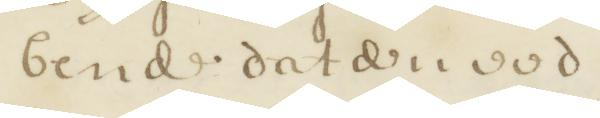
bende dat den eed
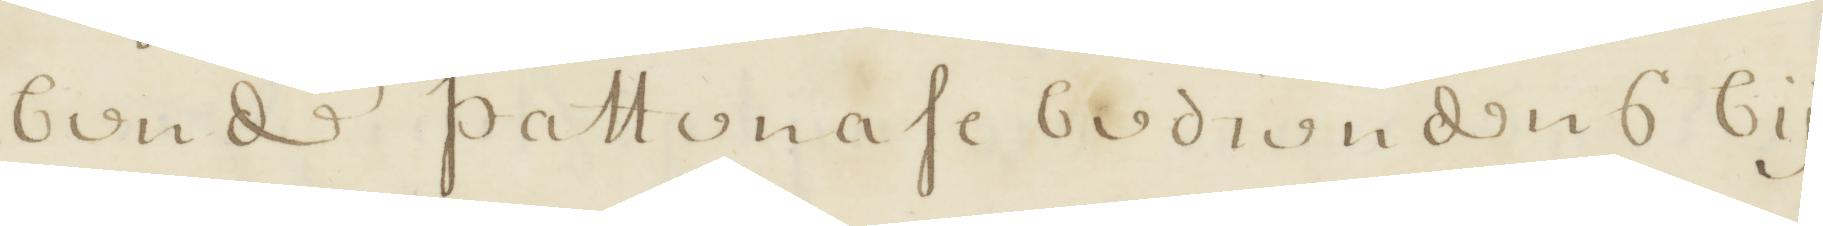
bende pattenase bediendens bij
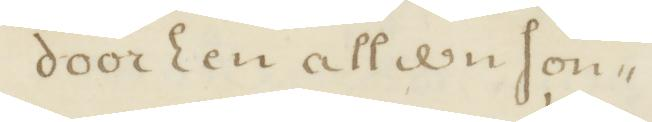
door hen alleen son„
